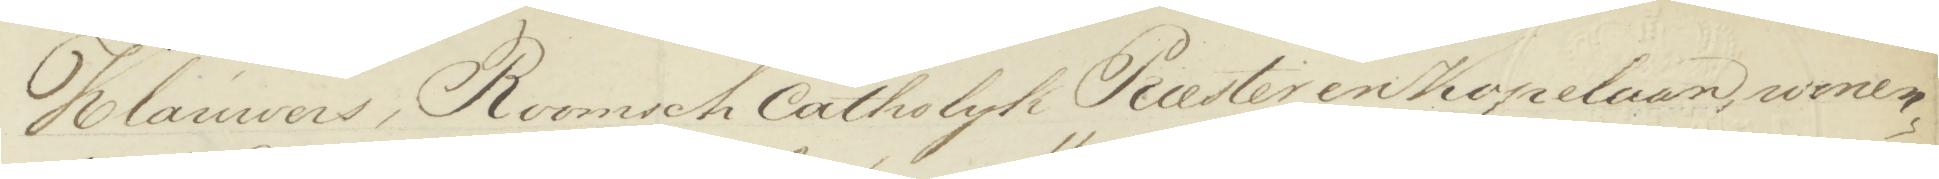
Klauwers, Roomsch Catholyk Priester en Kopelaan, wonen„
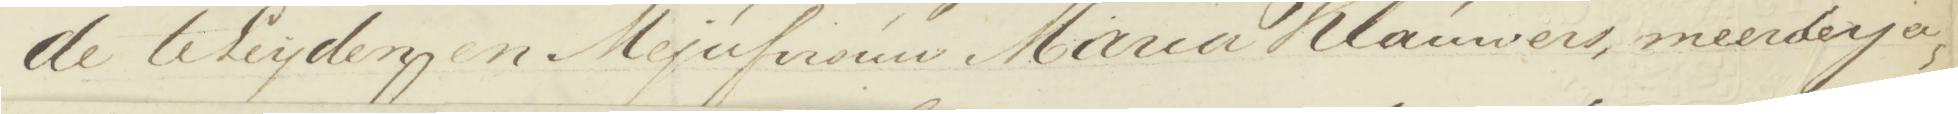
de te Leijden en Mejufvrouw Maria Klauwers, meerderja„
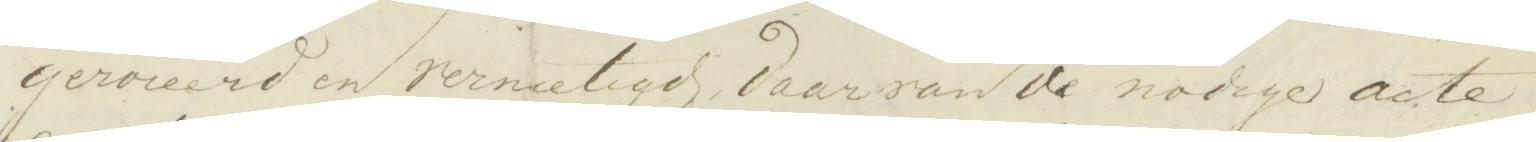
geroieerd en vernietigd, daarvan de nodige acte
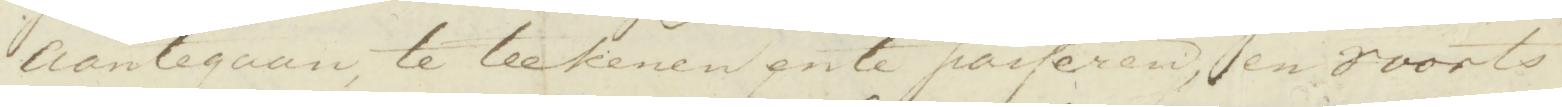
aantegaan, te teekenen en te passeren, en voorts
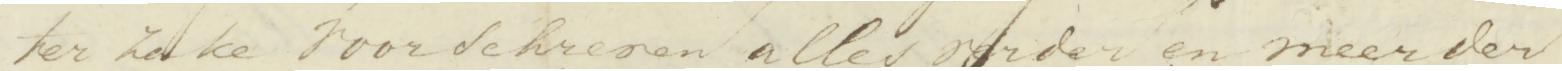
ter zake voorschreven alles verder en meerder
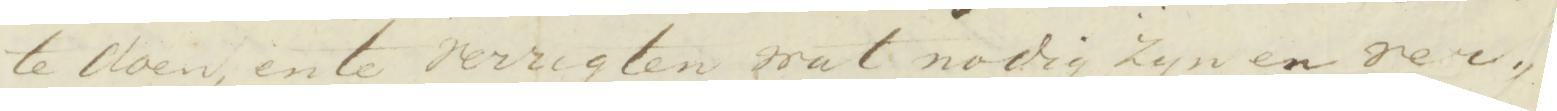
te doen, en te verrigten wat nodig zyn en ver„
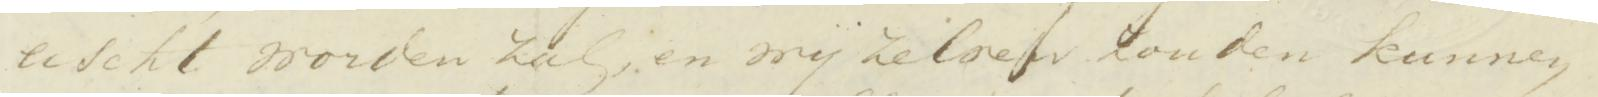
eischt worden zal, en wij zelven zouden kunnen
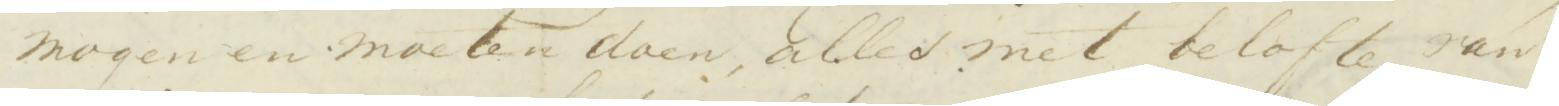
mogen en moeten doen, alles met belofte van
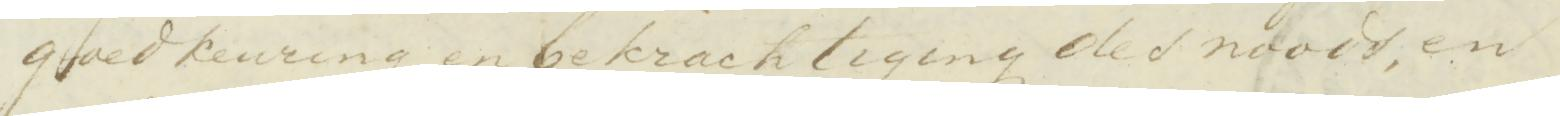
goedkeuring en bekrachtiging des noods, en
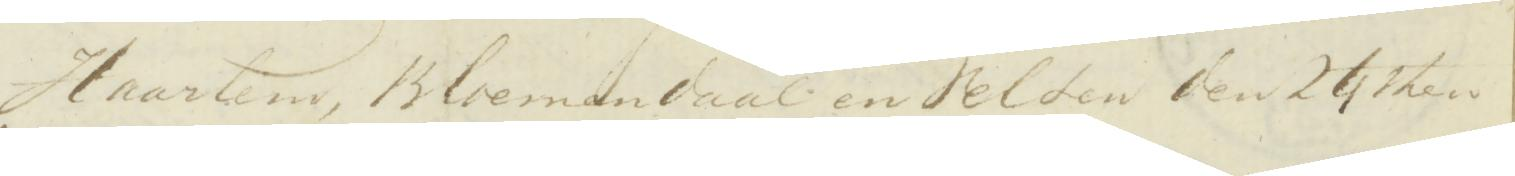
Haarlem, Bloemendaal en Velsen den 24sten
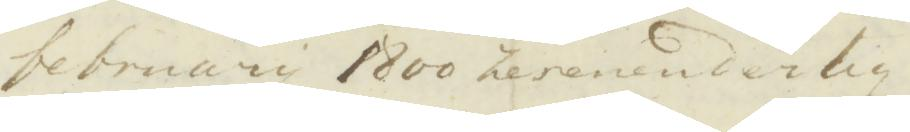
februarij 1800 zevenendertig
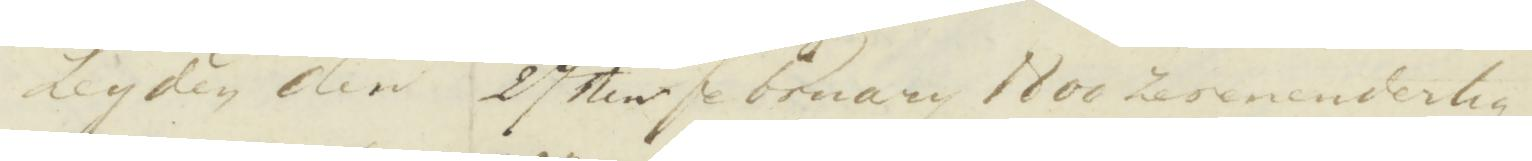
Leyden den 27sten february 1800 zevenendertig
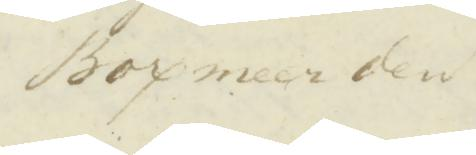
Boxmeer den
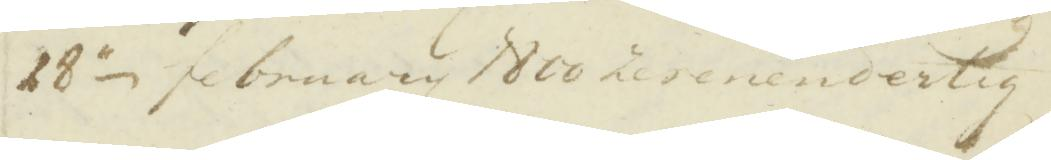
28=„ february 1800 zevenendertig
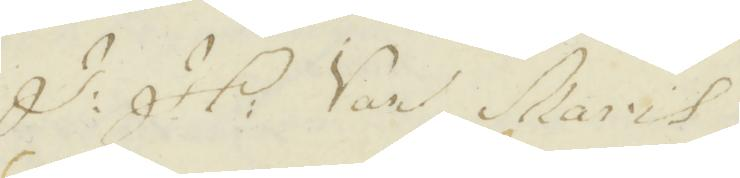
I: H: Van Maris
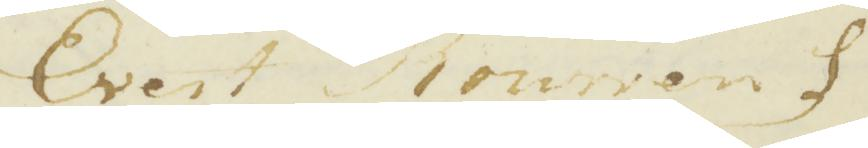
Evert Bouwens
